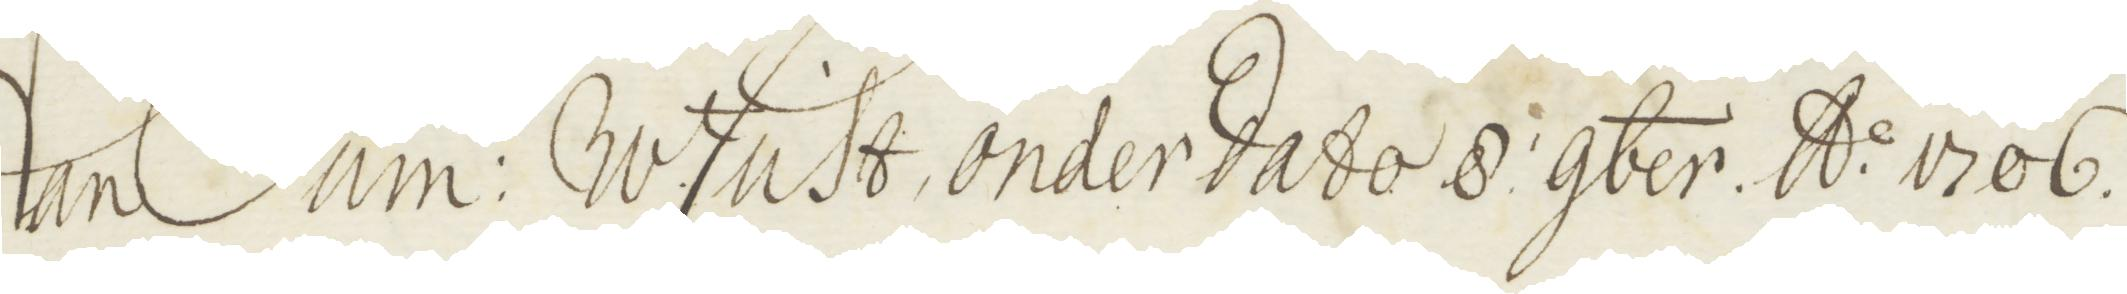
Van Sum:ans W.t Cust, onder dato 8: 9ber A:o 1706.
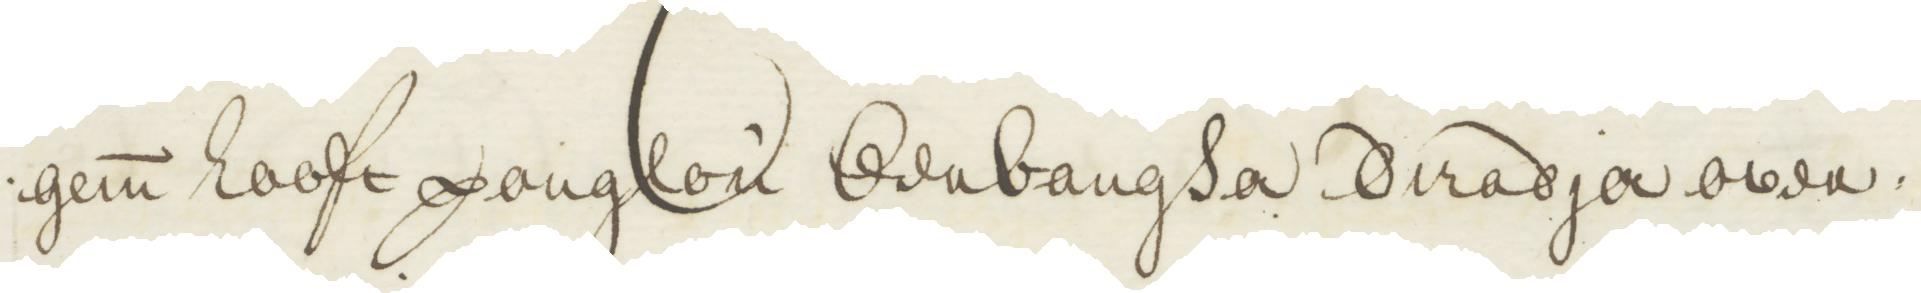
gem hooft ponglou berbangsa diradja over=
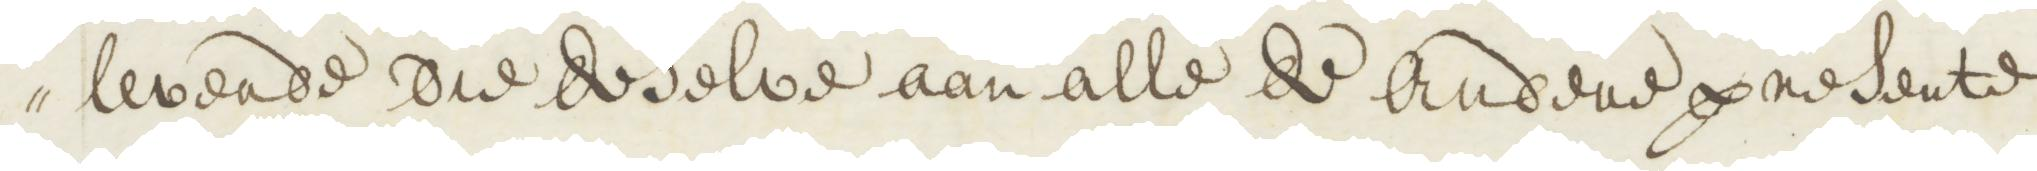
„leverde die deselve aan alle de andere presente
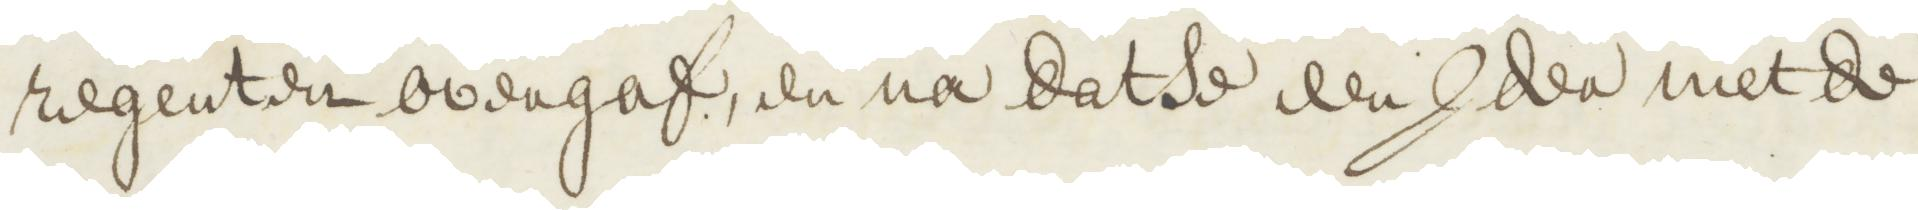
regenten overgaf, en na datse een jder met de
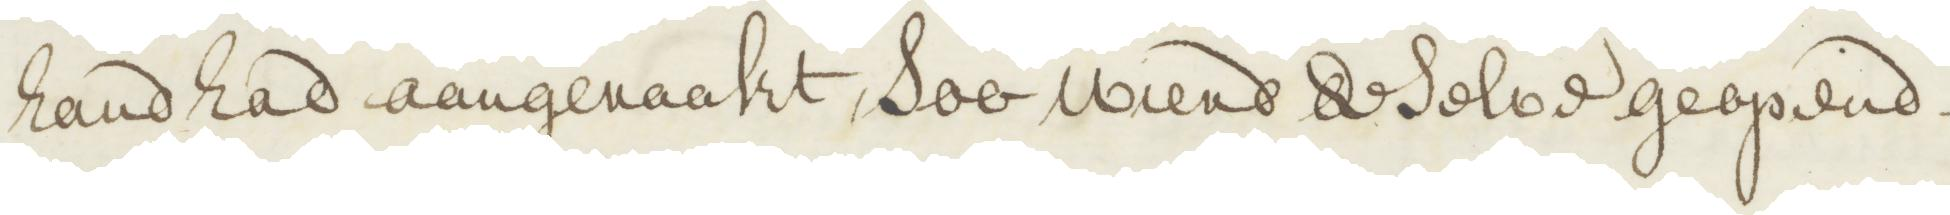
hand had aangeraakt, soo wierd deselve geopend
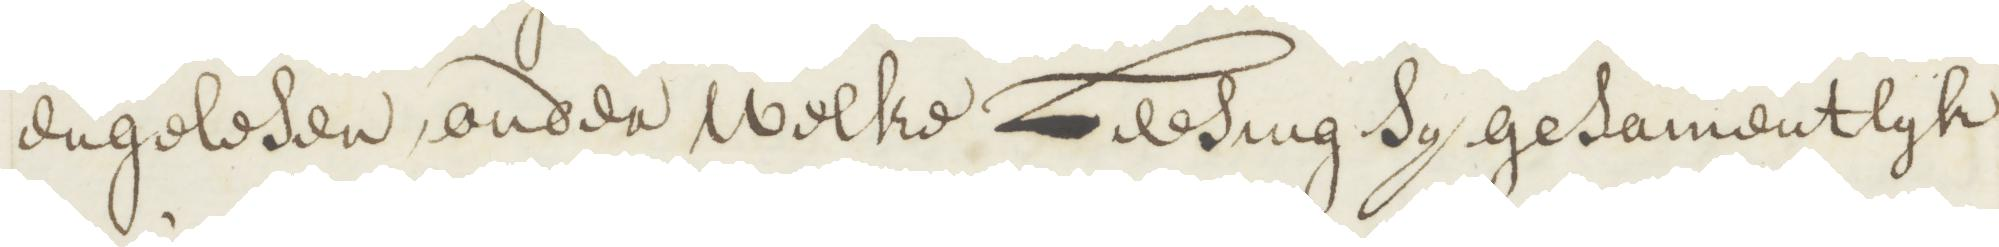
en gelesen, onder welke Leesing sy gesamentlijk
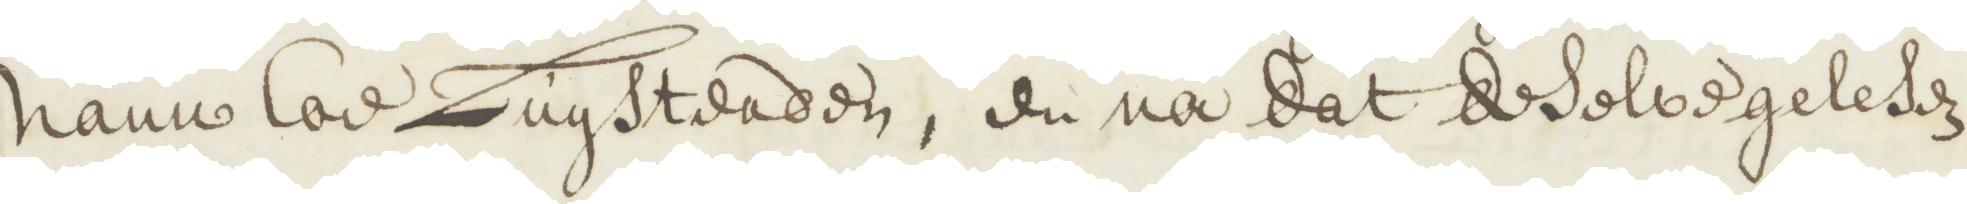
nauw toe Luysterden, en na dat deselve gelesen
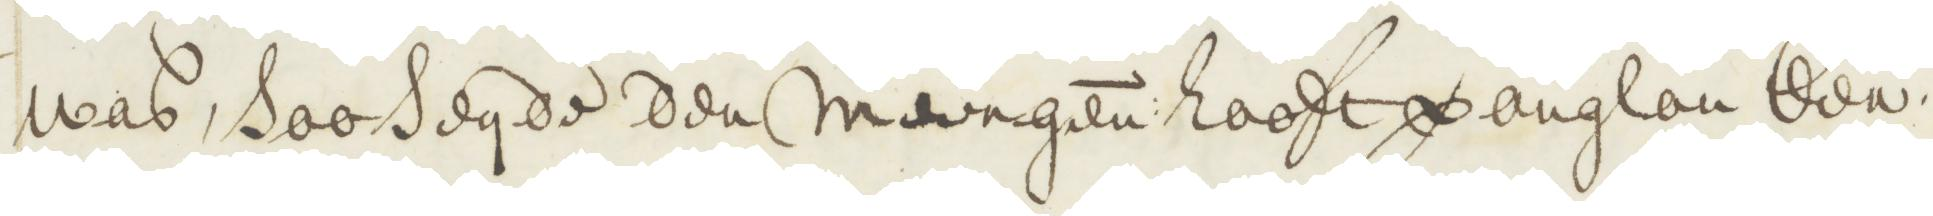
was, soo seyde den meergen: hooft ponglou ber,
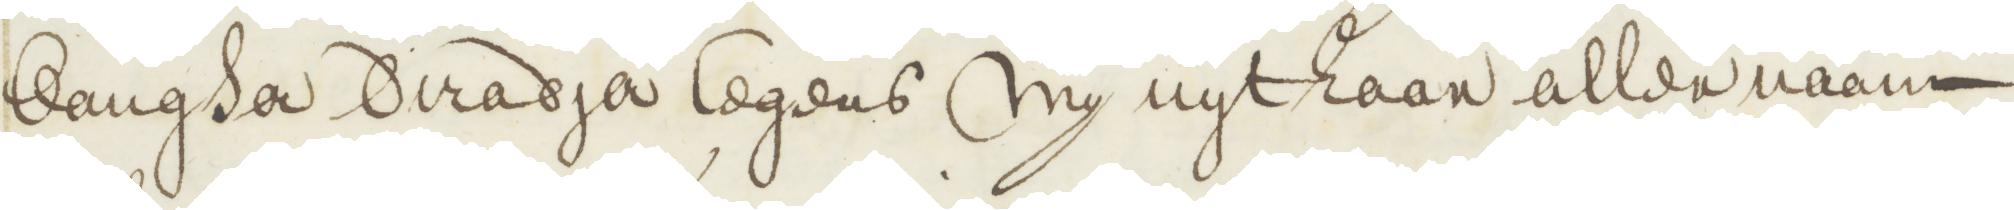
bangsa biradja tegens mij uyt haar aller naam
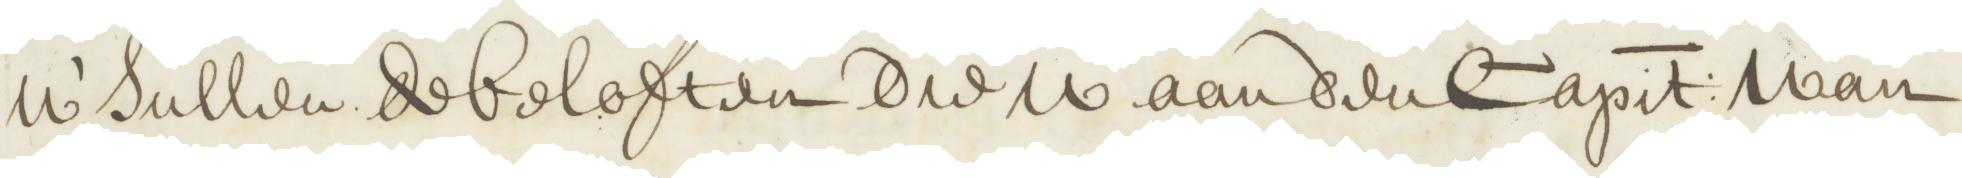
w' sullen de beloften die w' aan den Capit: wan
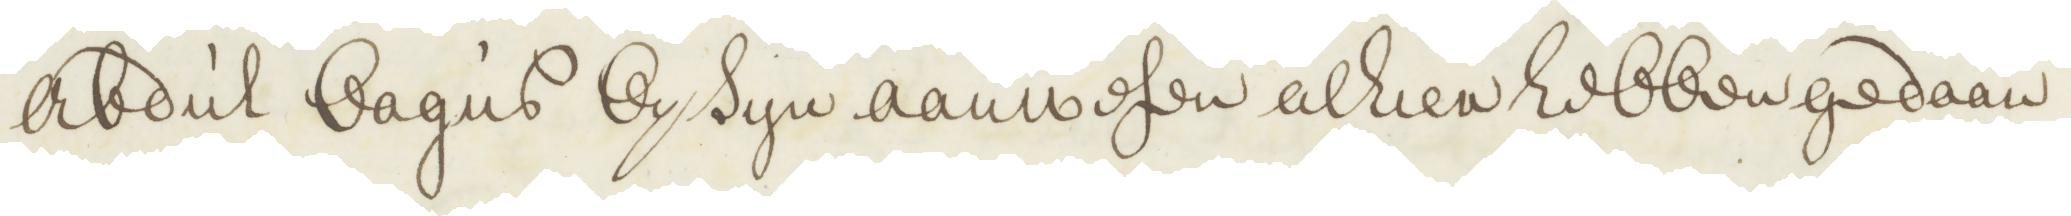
abdul bagus by sijn aanwesen alhier hebben gedaan
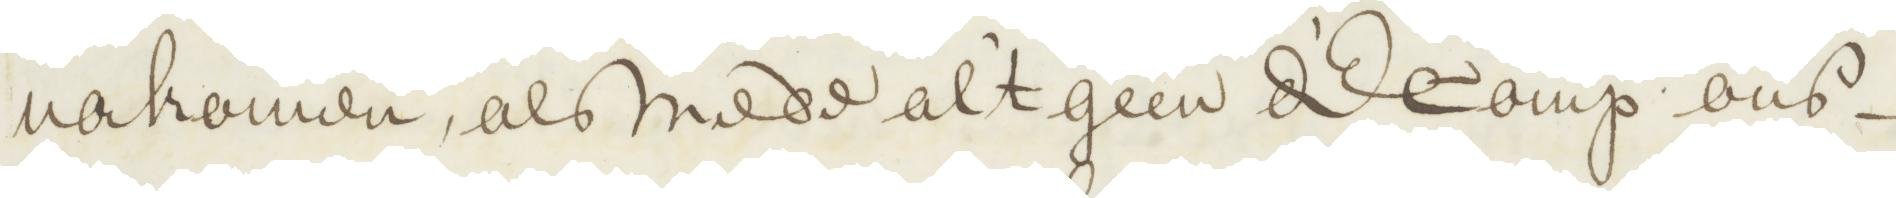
nakomen, als mede al't geen d'E Comp:e ons
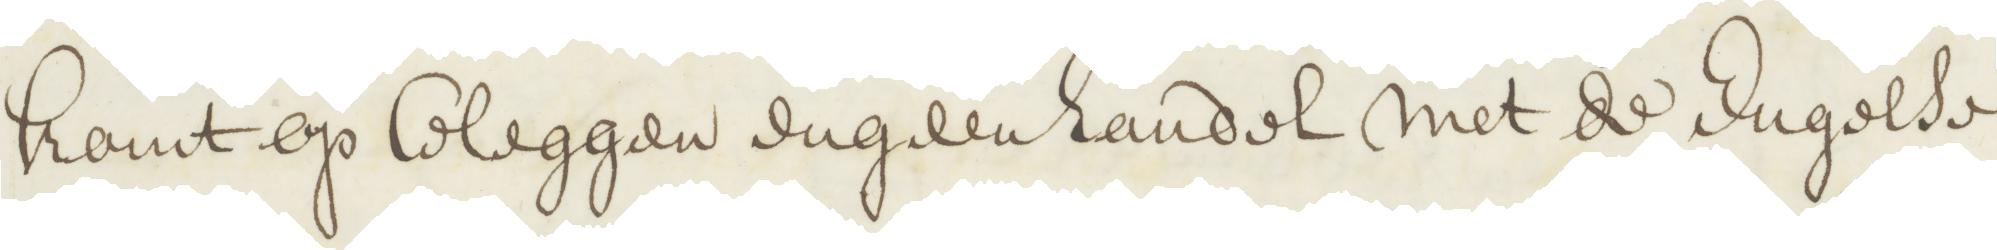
komt op te leggen en geen handel met de Engelse
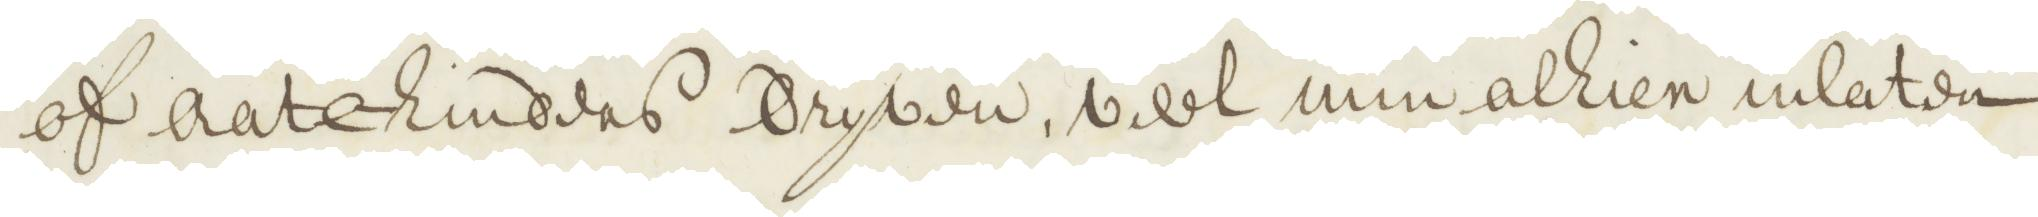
of aatchinders drijven, veel min alhier inlaten
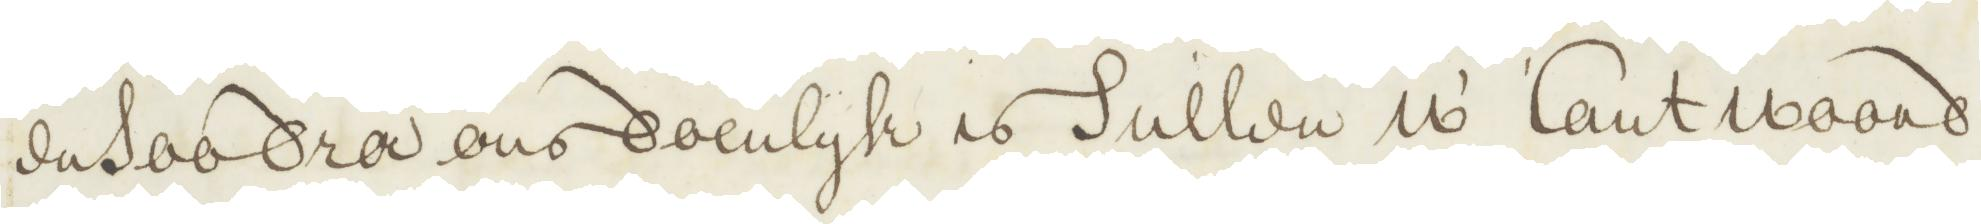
en soodra ons doenlijk is sullen w' 'tantwoord
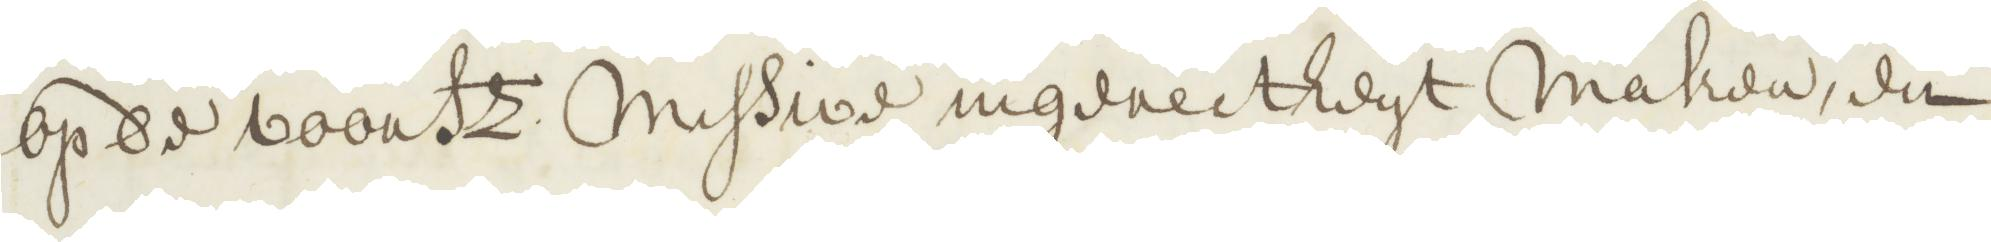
op de voorsz: missive ingereetheyt maken, en
